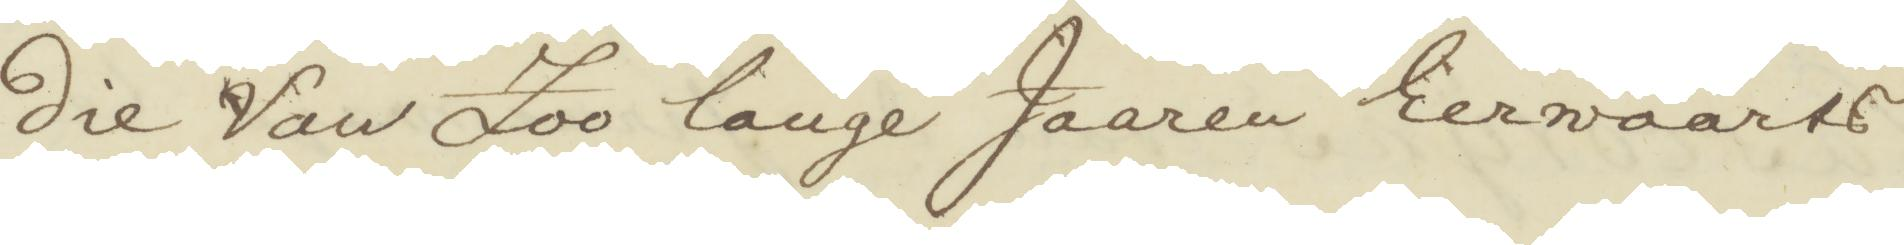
die van zoo lange Jaaren herwaarts
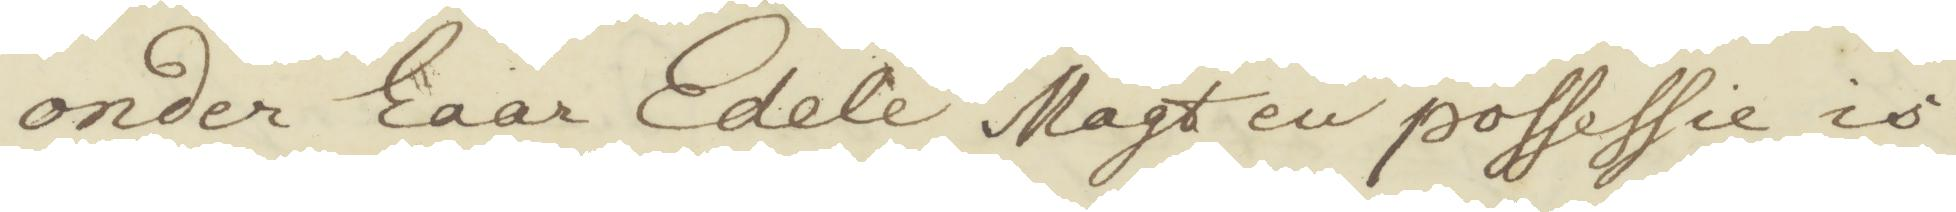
onder haar Edele Magt en possessie is
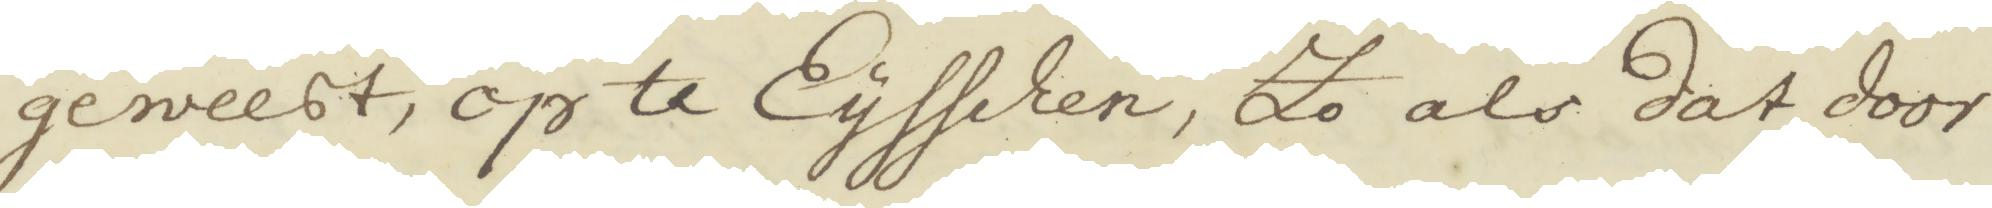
geweest, op te Eijsschen, zo als dat door
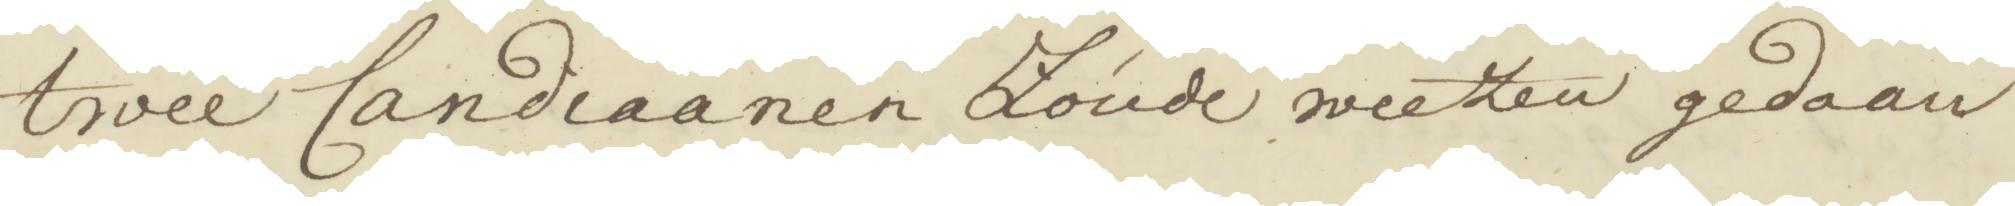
twee Candiaanen zoude weezen gedaan
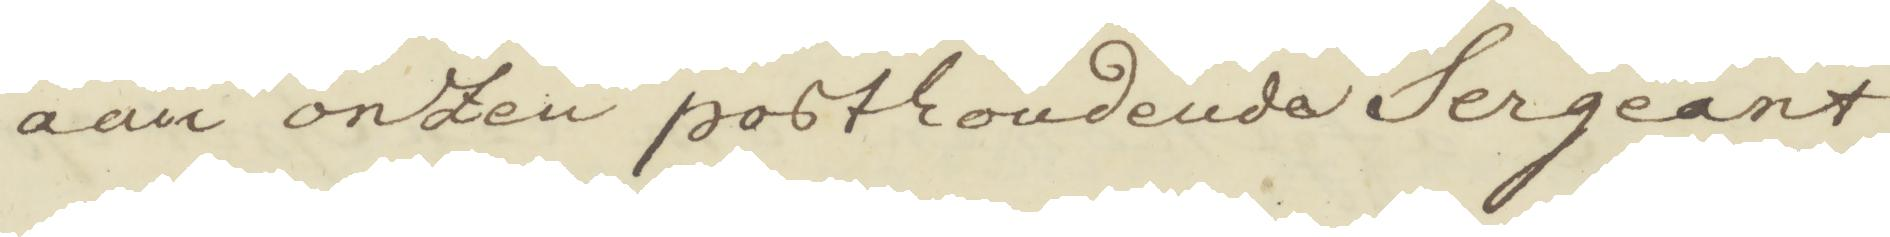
aan onzen posthoudende sergeant
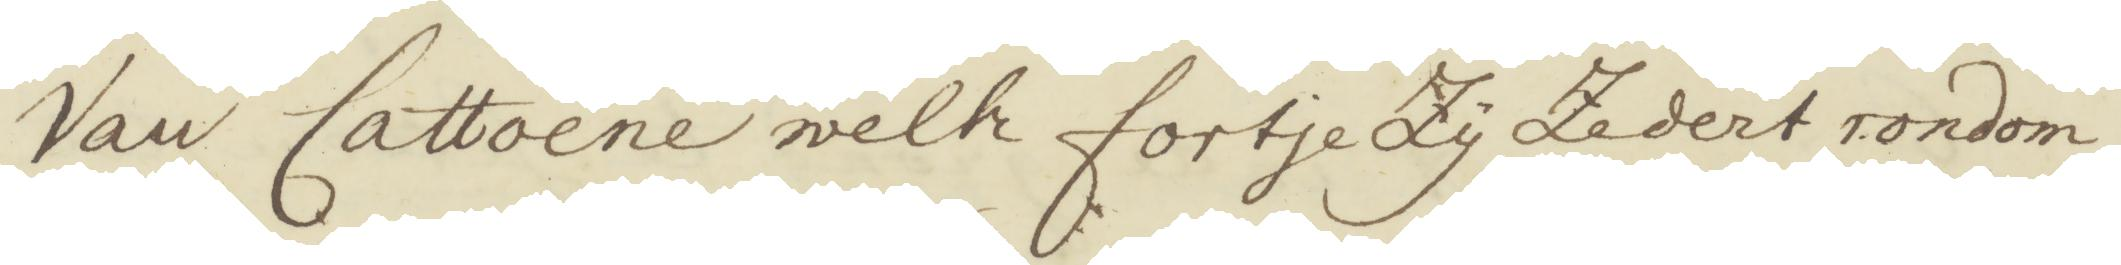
van Cattoene welk fortje zij zedert rondom
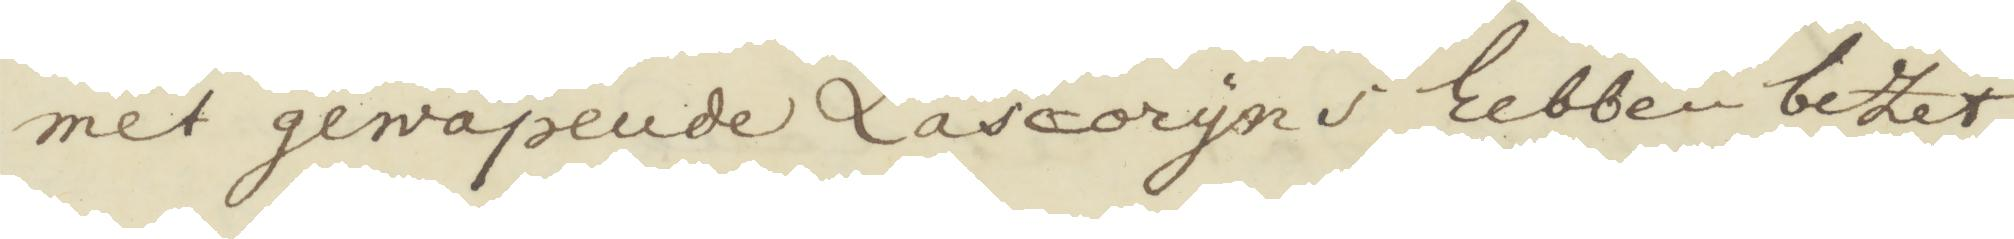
met gewapende Lascorijns hebben bezet
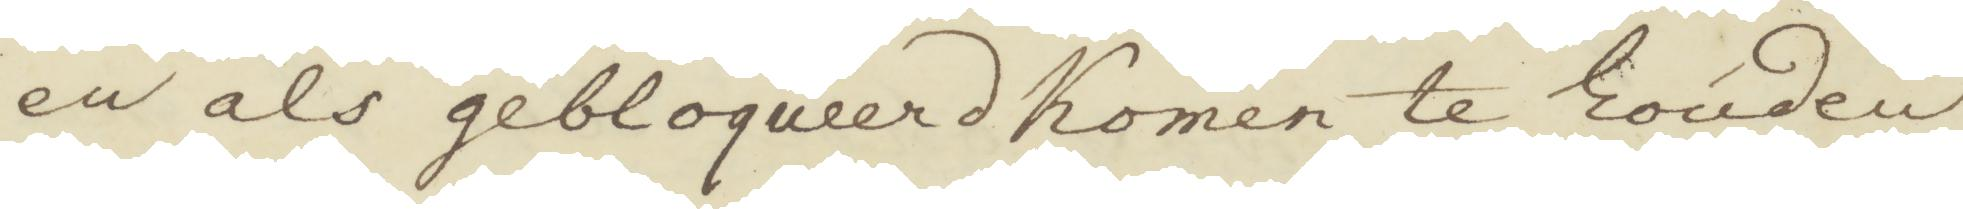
en als gebloqueerd komen te houden
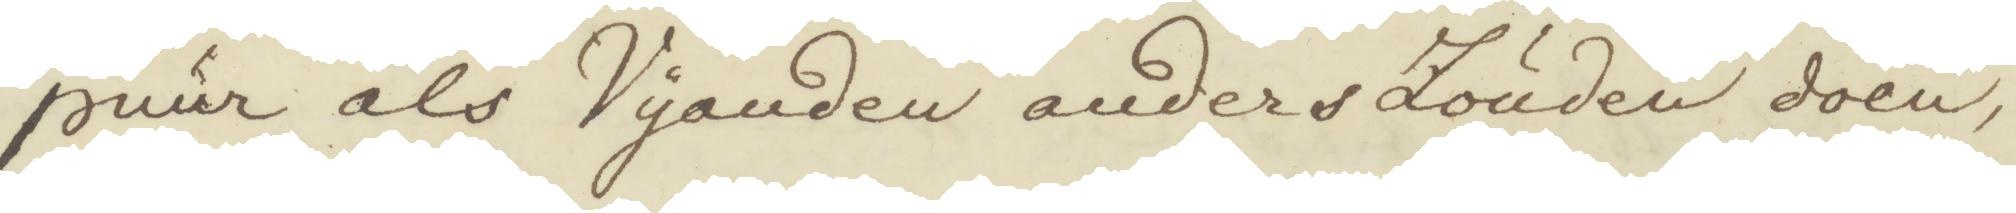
puur als Vijanden anders zouden doen,
